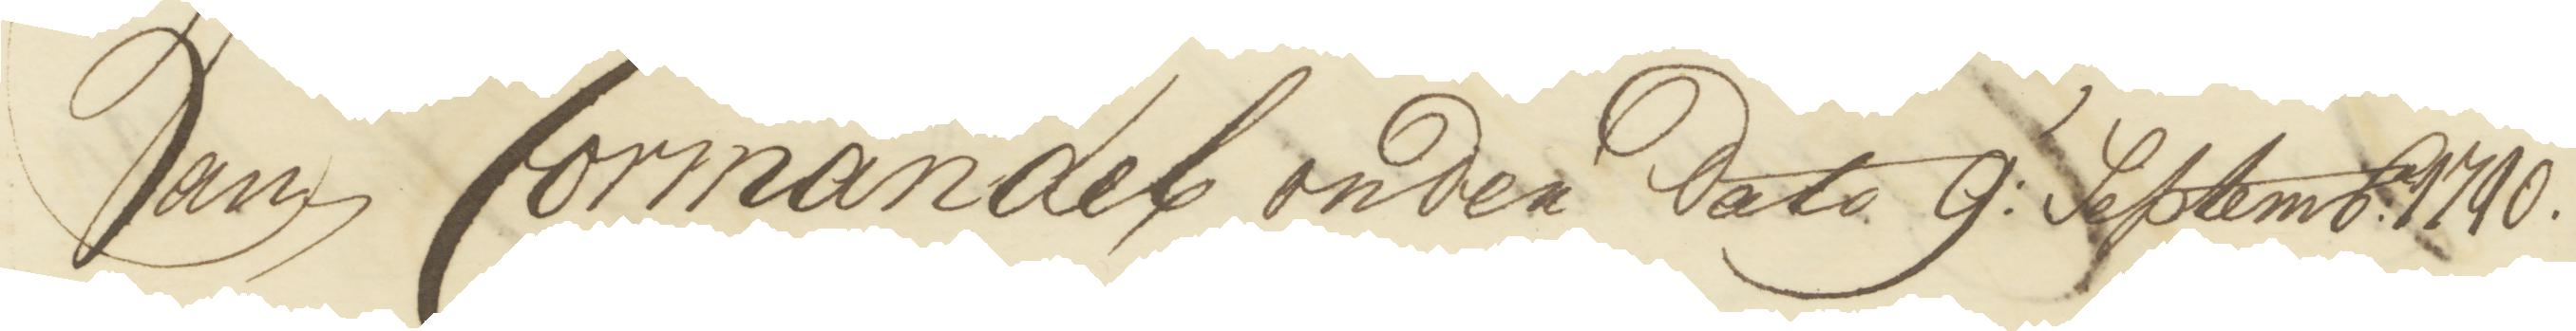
Van Cormandel onder dato 9:' Septemb:r 1740.
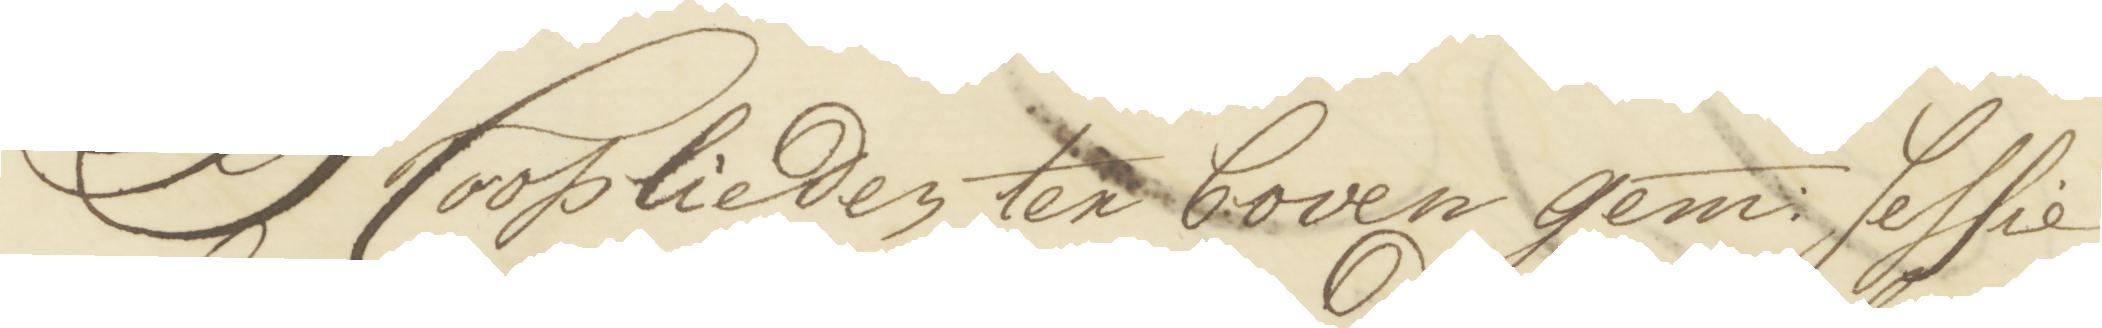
D' Cooplieden ter boven gem: sessie
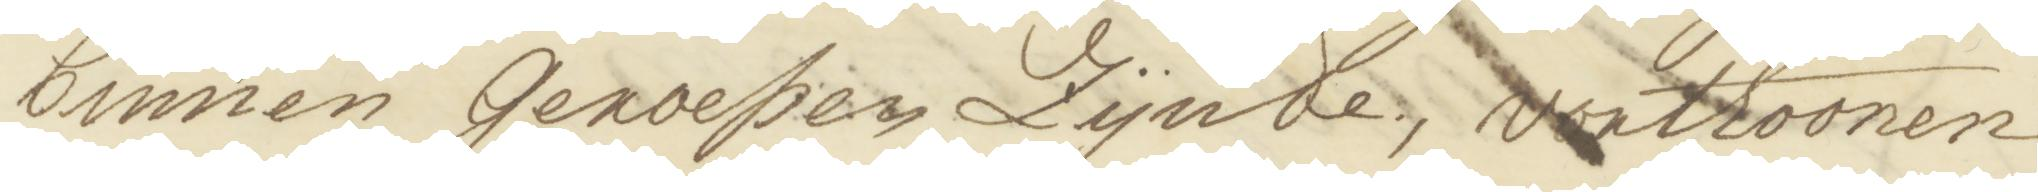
binnen geroepen zijnde., vorthoonen
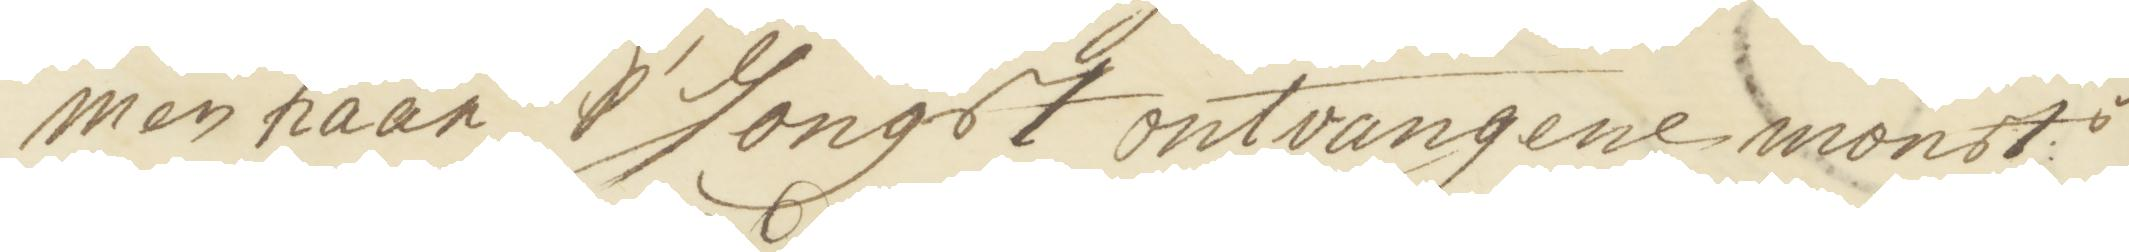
men haar d' Jongst ontvangene monst:s
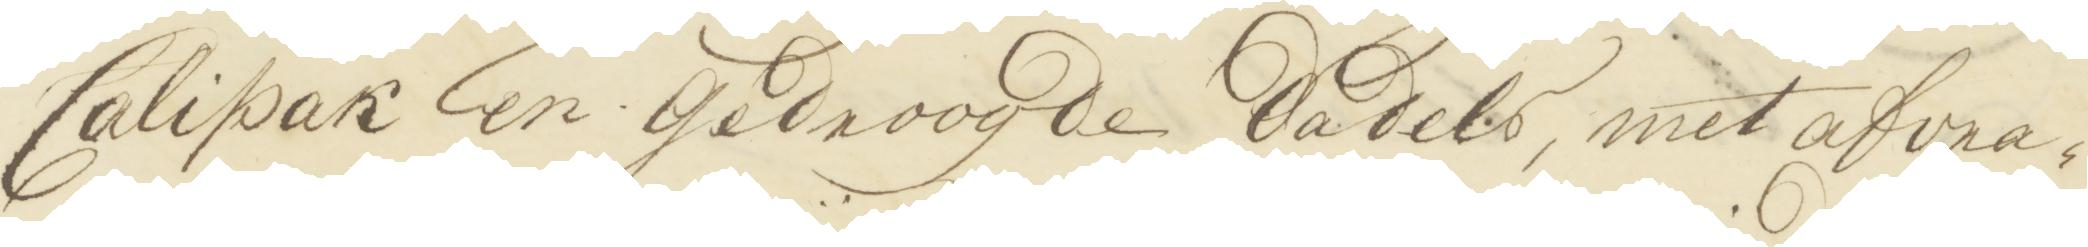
Calipak en Gedroogde dadels, met afvra„
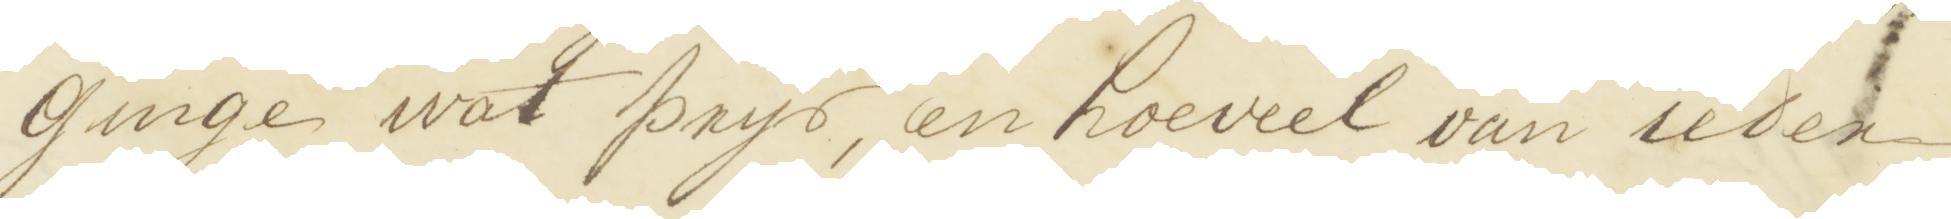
ginge wat prijs, en hoeveel van ieder
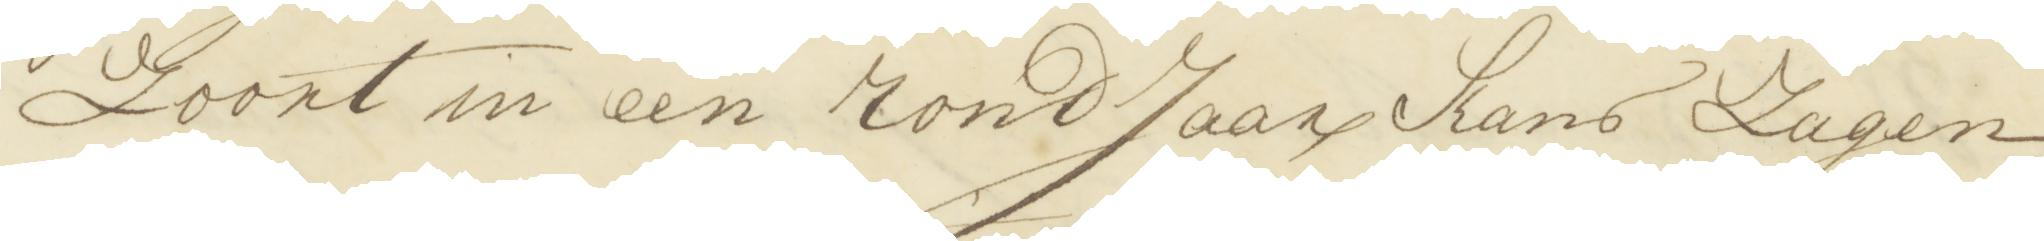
zoort in een rond Jaar kans zagen
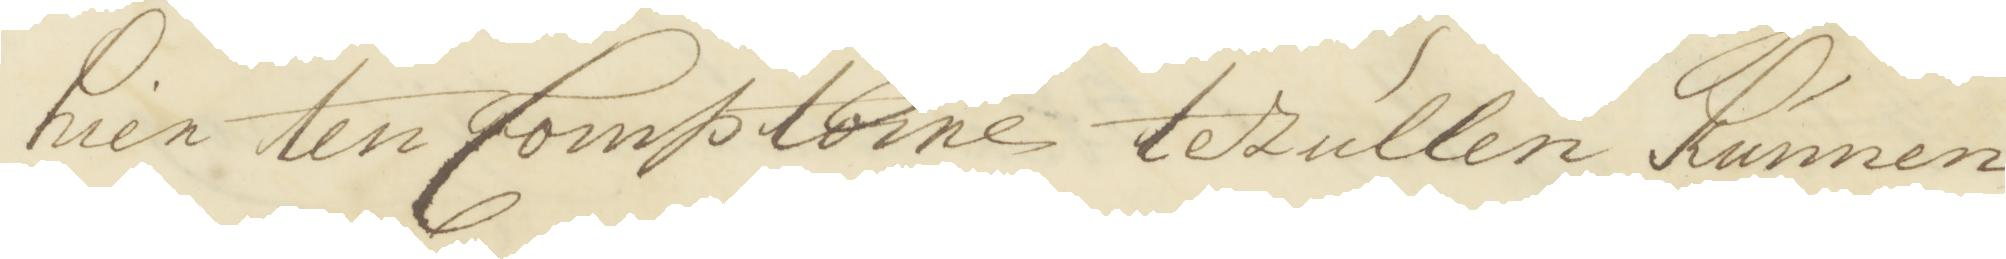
hier ten Comptoire tezullen kunnen
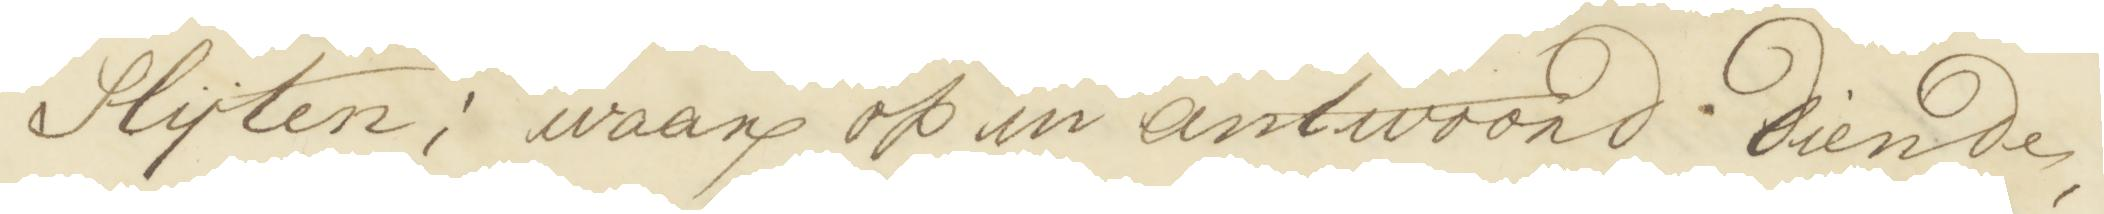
slijten; waar op in antwoord diende,
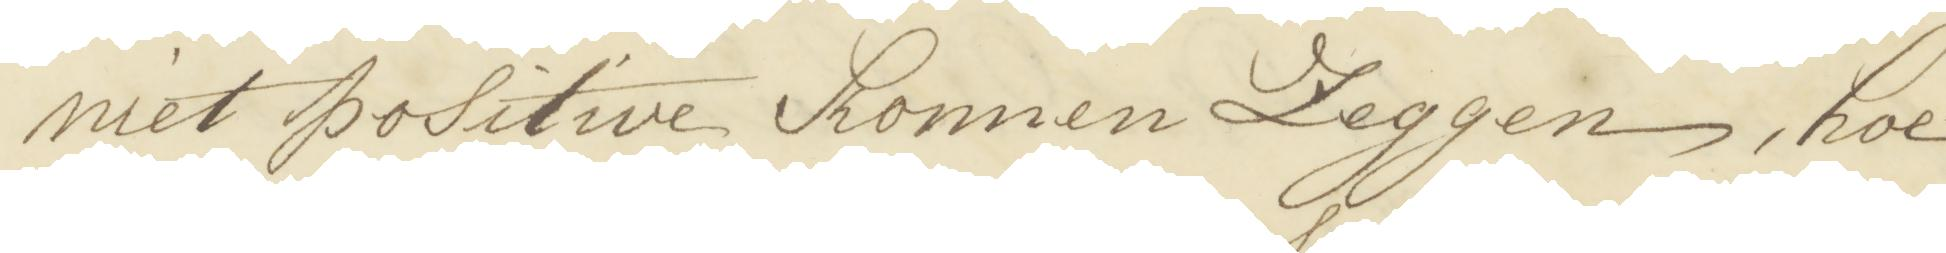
niet positive konnen zeggen, hoe
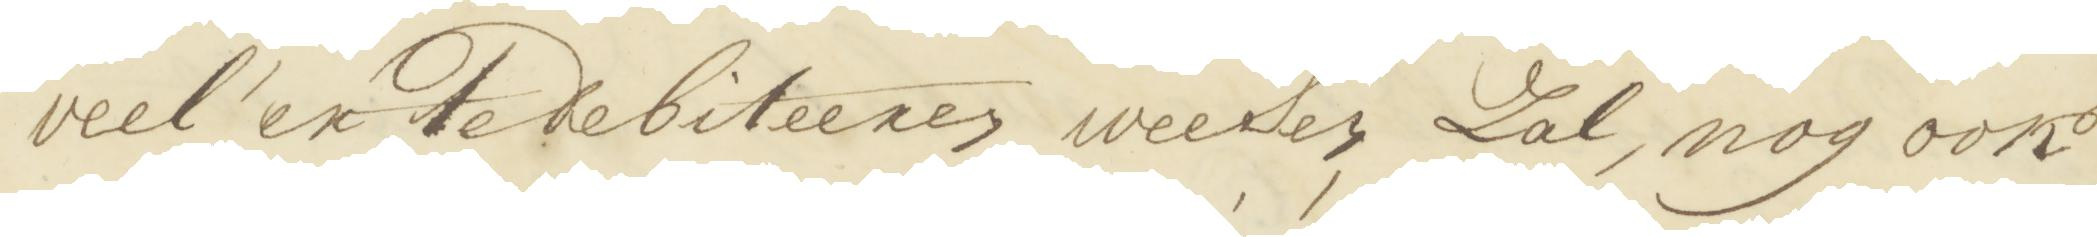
veel 'er te debiteeren weesen zal, nog ook
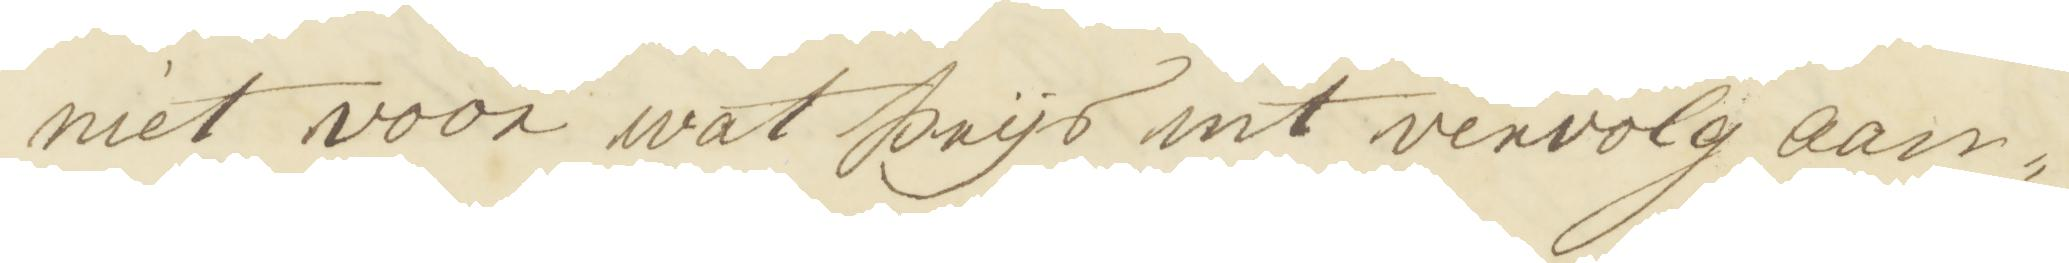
niet voor wat prijs in't vervolg aan„
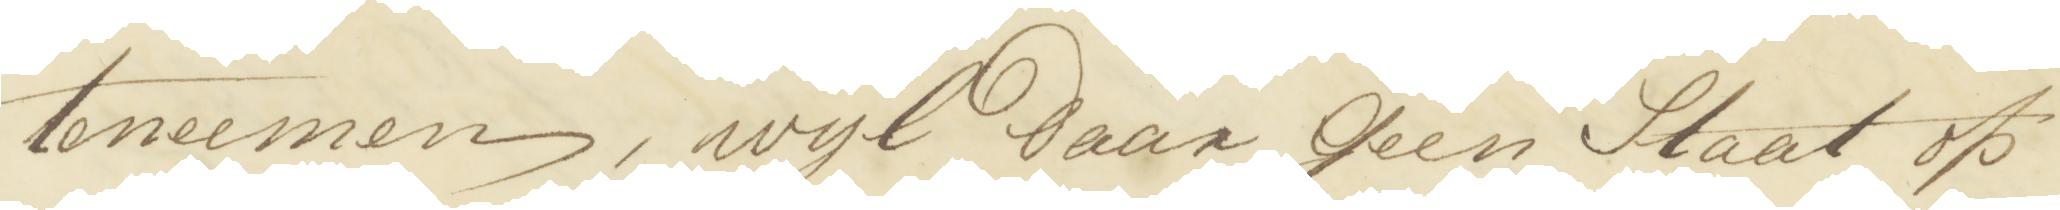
teneemen, wijl daar geen staat op
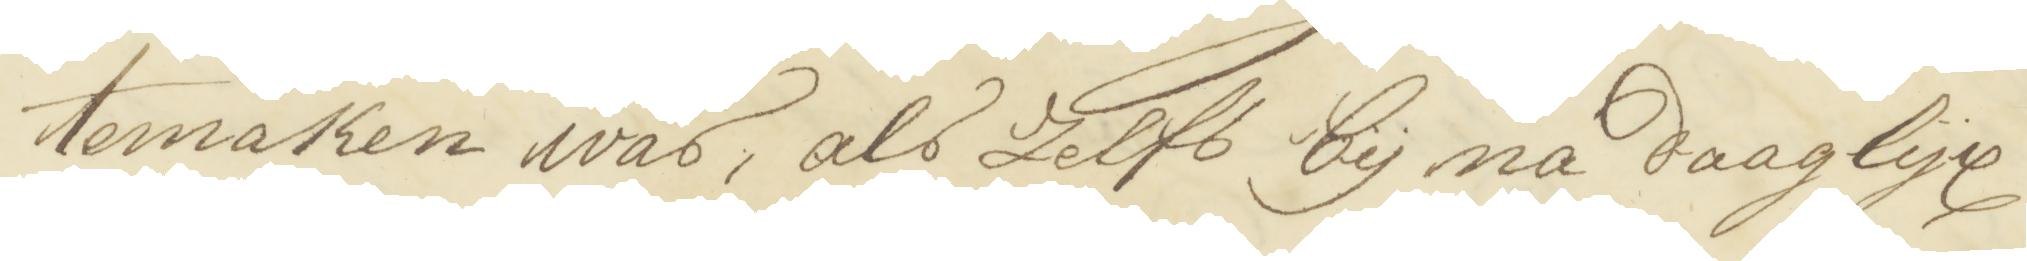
temaken was, als zelfs bij na daaglijx
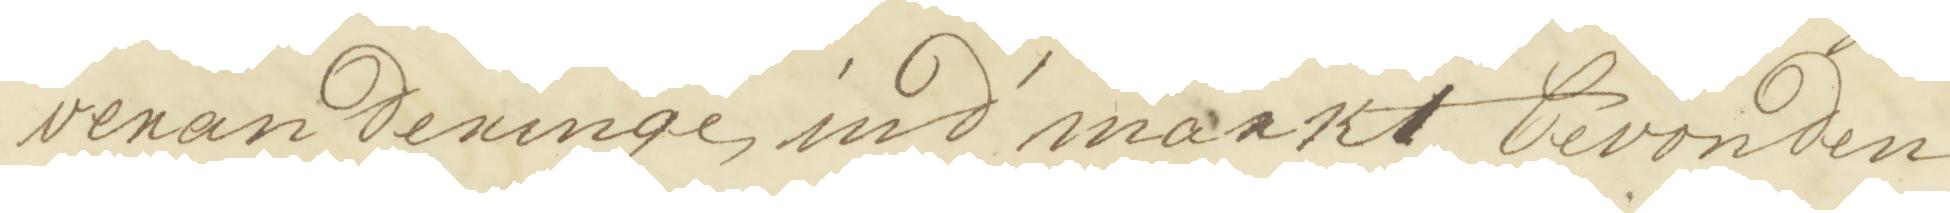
veranderinge ind’ markt bevonden
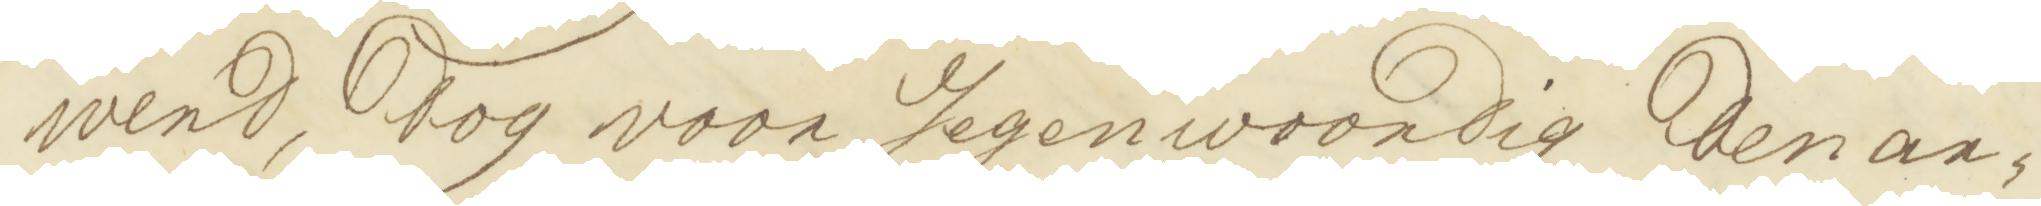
werd, dog voor Jegenwoordig den ar„
